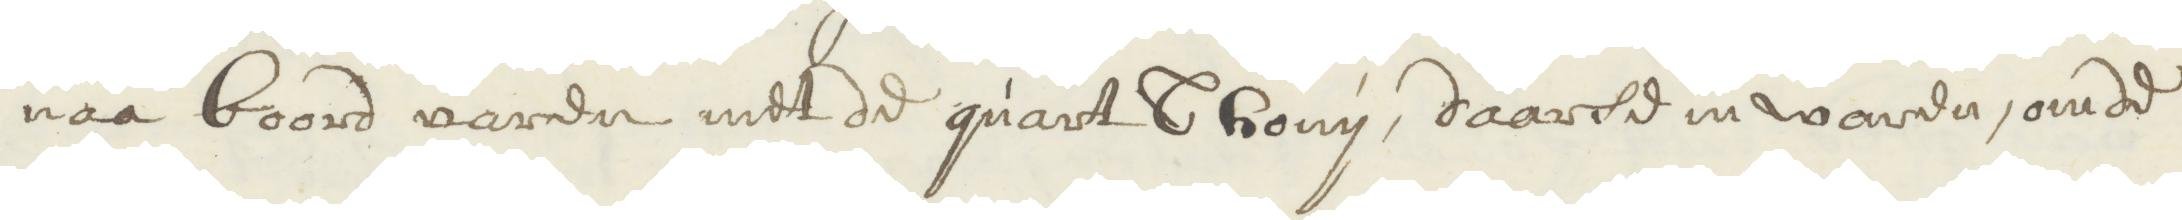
naa boord varen met de quart Thonij, daarse in waren, om de
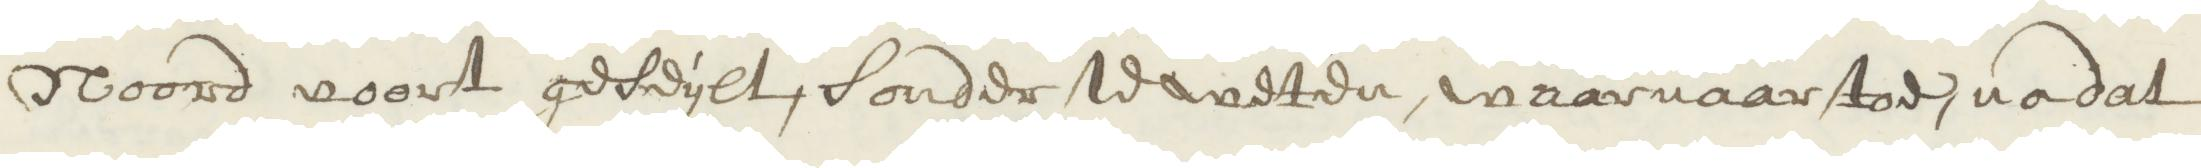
Noord voort geseijlt, sonder te weten, waar naar toe, na dat
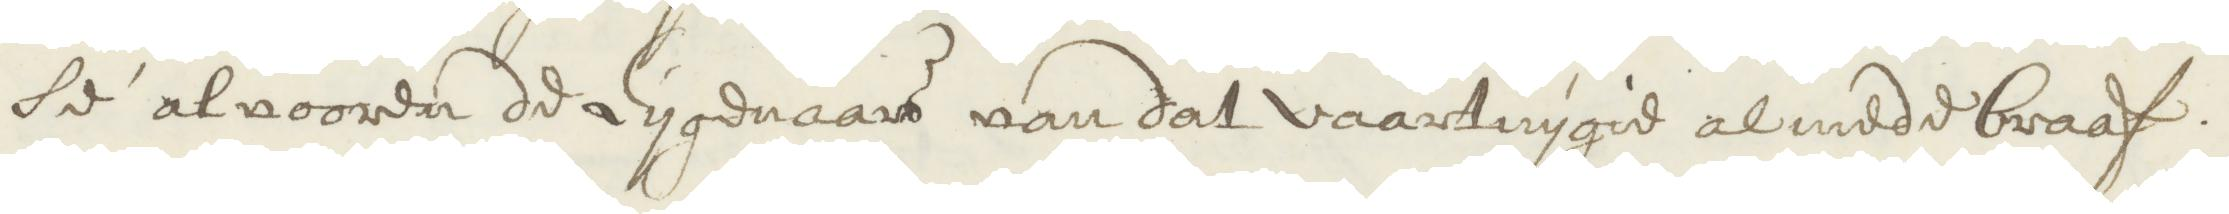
se' alvooren de Eijgenaars van dat vaartuijgie al mede braaf
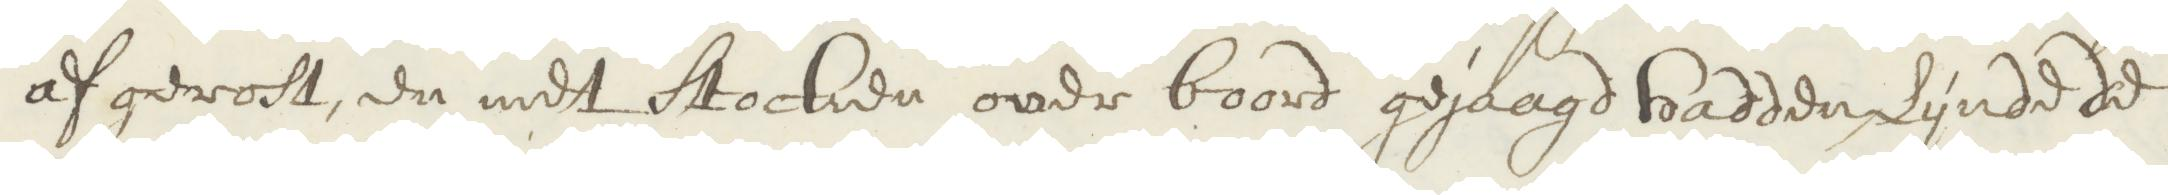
af gerost, en met stocken over boord gejaagd hadden, zijnde de
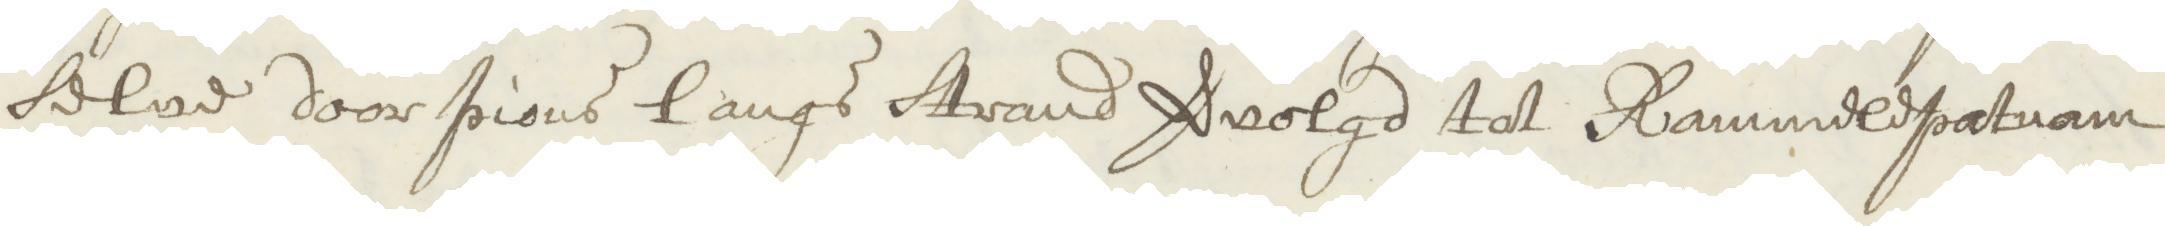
selve door pions langs strand vervolgd tot Rammelepatram
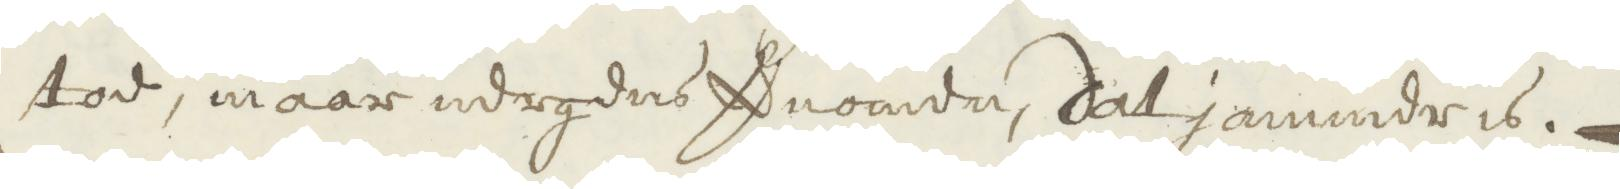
toe, maar nergens vernomen, dat jammer is.
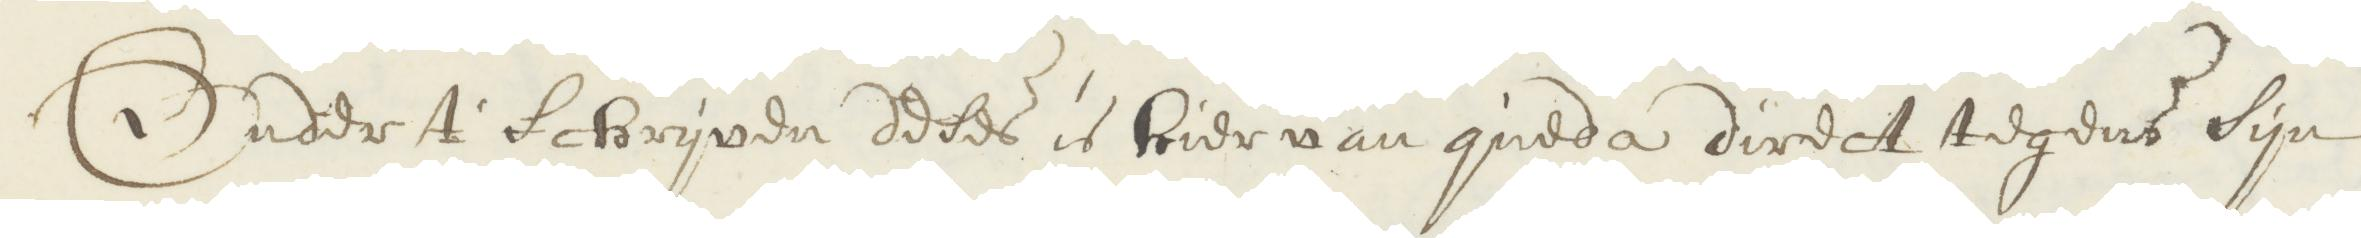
Onder t' schrijven deses is hier van queda direct tegens sijn
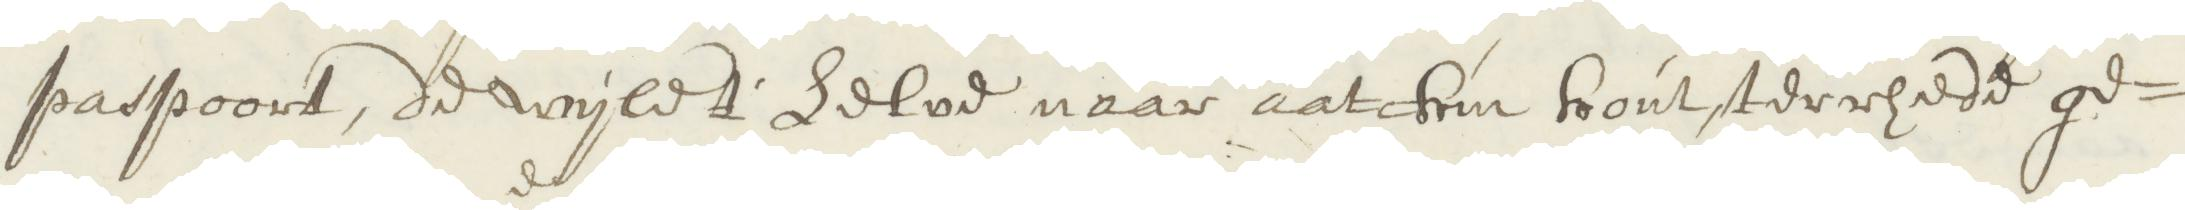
paspoort, de wijle t’ zelve naar aatchin hout, ter rhede ge=
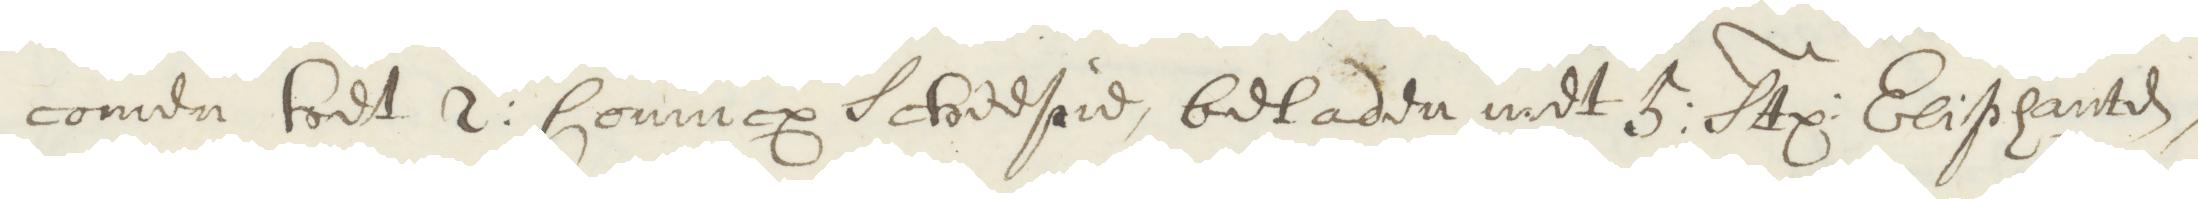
comen het 2:e Conincx scheepie, beladen met 5: stx: Eliphanten,
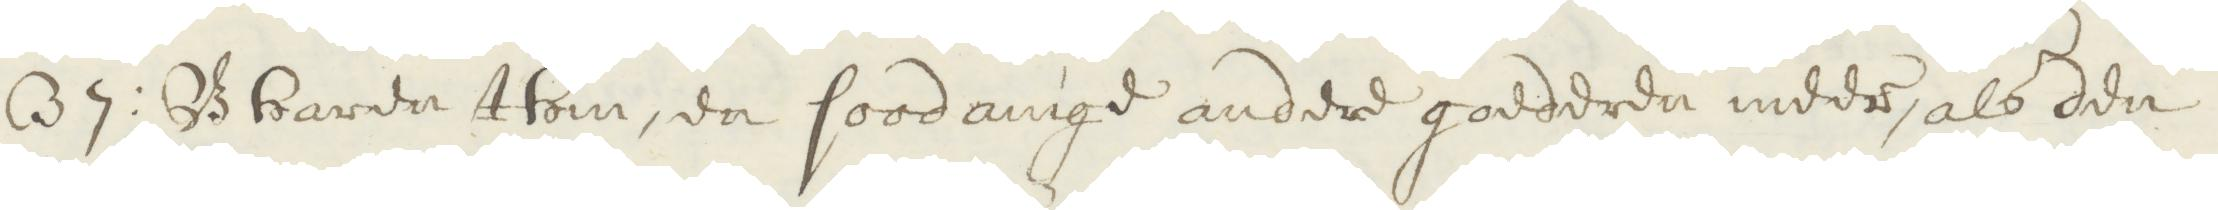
37: Bharen thin, en soodanige andere goederen meer, als den
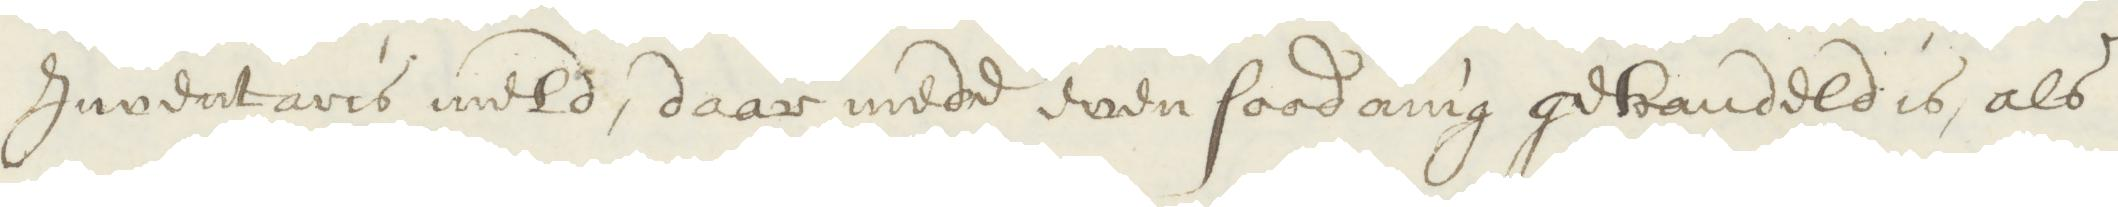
Inventaris meld, daar mede even soodanig gehandeld is, als
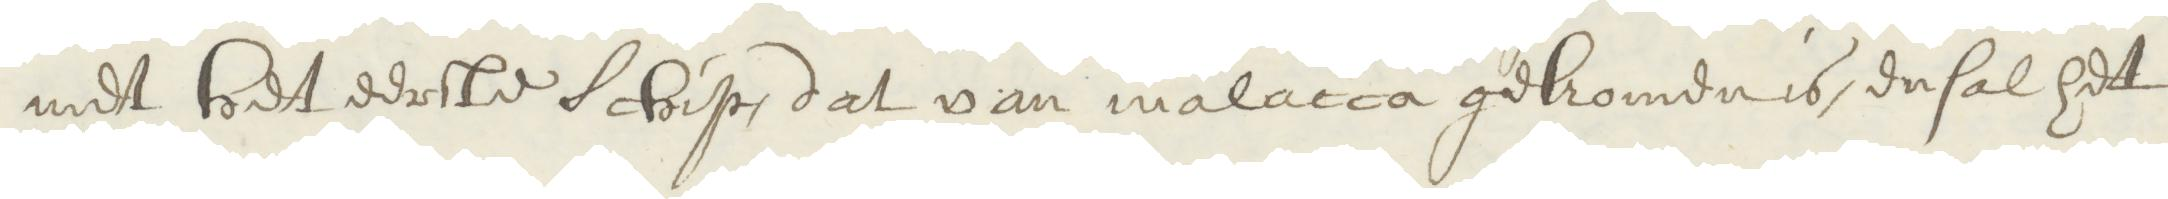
met het eerste schip, dat van malacca gekomen is, en sal het
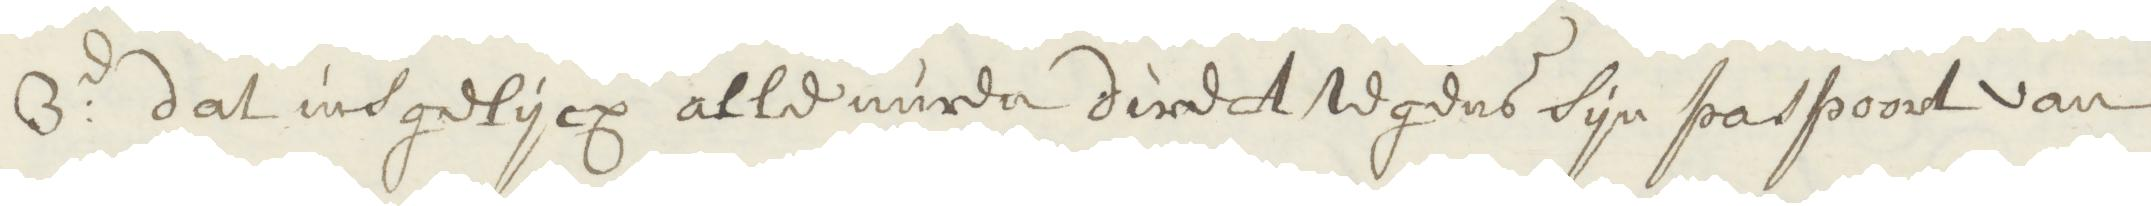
3:' dat insgelijcx alle uuren direct tegens sijn paspoort van
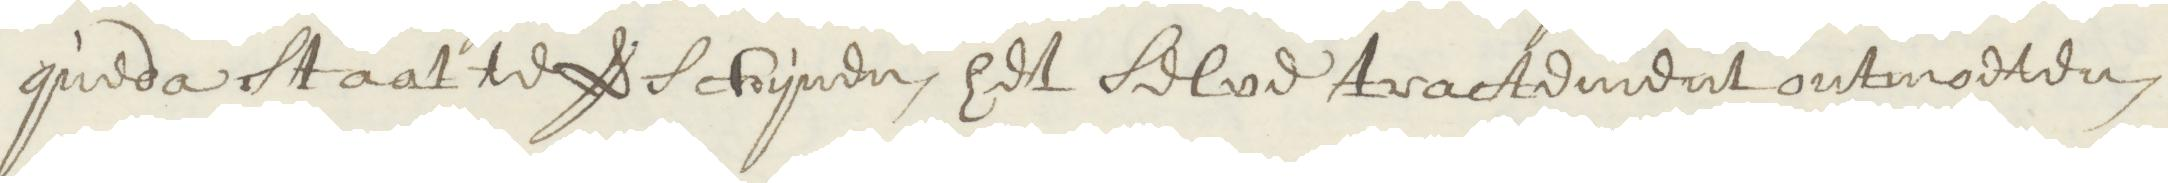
queda staat te verschijnen, het selve tractement ontmoeten,
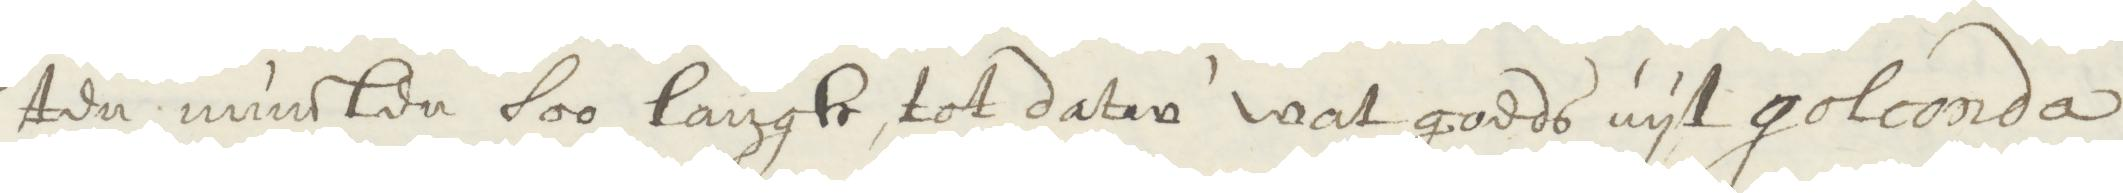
ten minsten soo langh, tot dat w' wat goeds uijt golconda
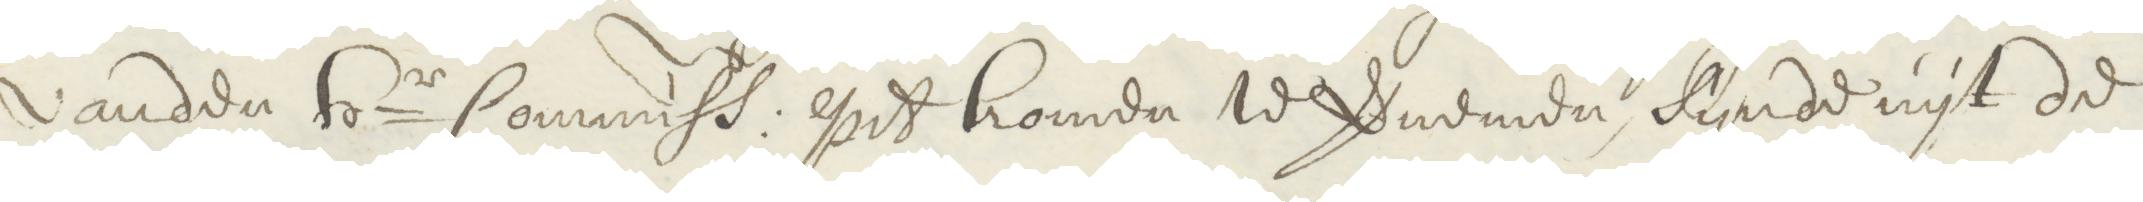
van den h=r Commiss: Pit komen te vernemen, sijnde uijt de
